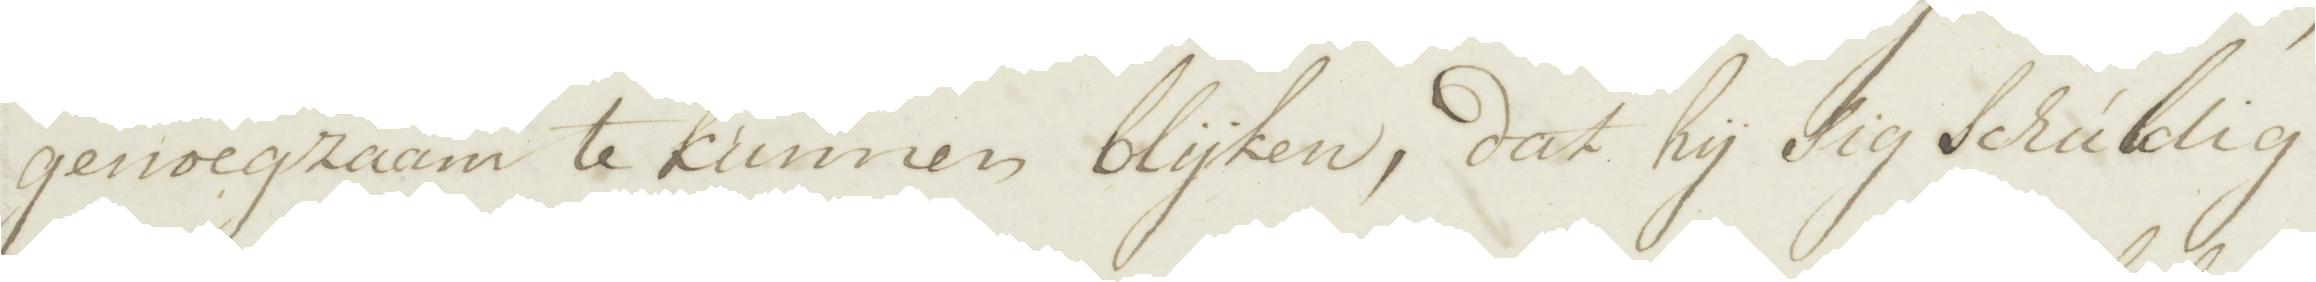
genoegzaam te kunnen blijken, dat hij sig schuldig
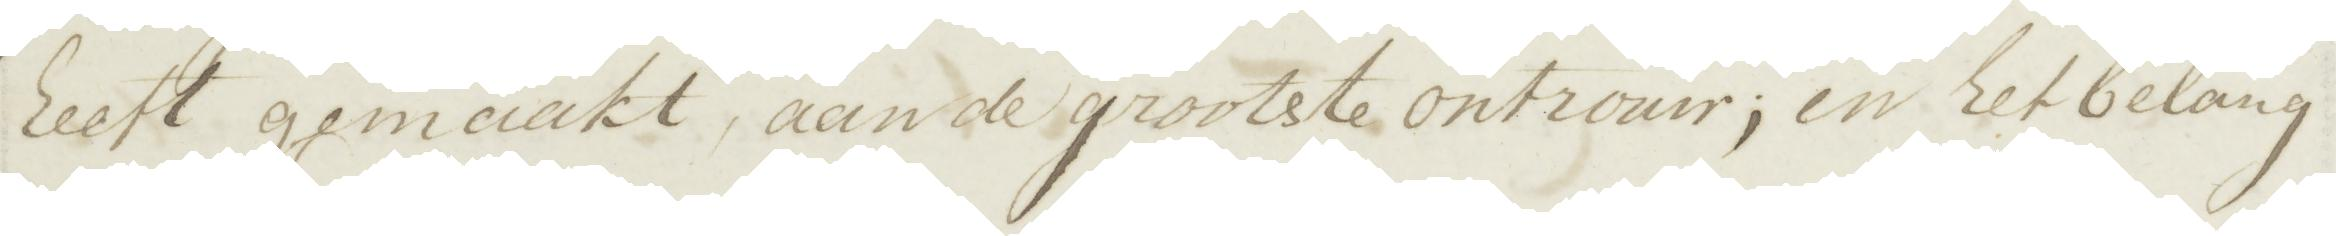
heeft gemaakt, aan de grootste ontrouw; en het belang
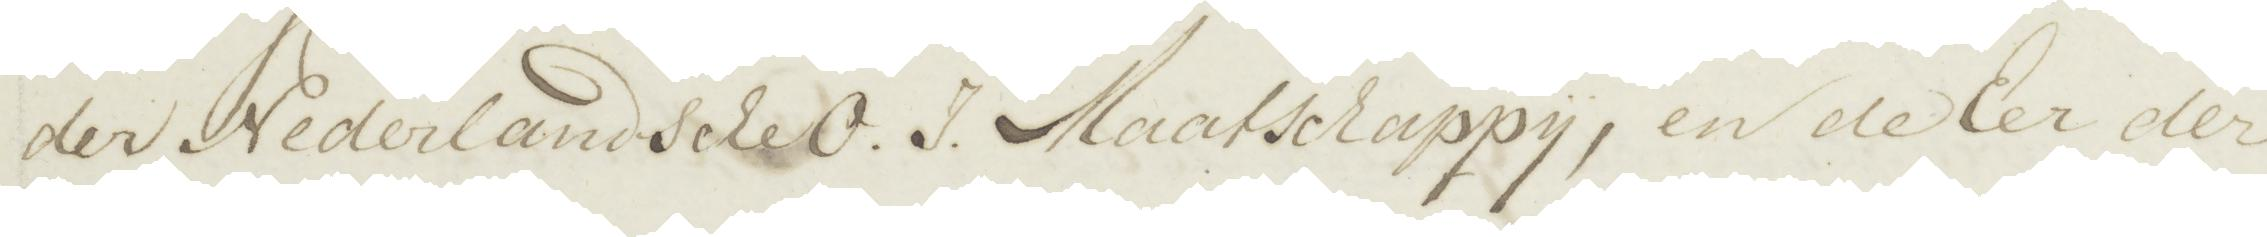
der Nederlandsche O. I. Maatschappij, en de Eer der
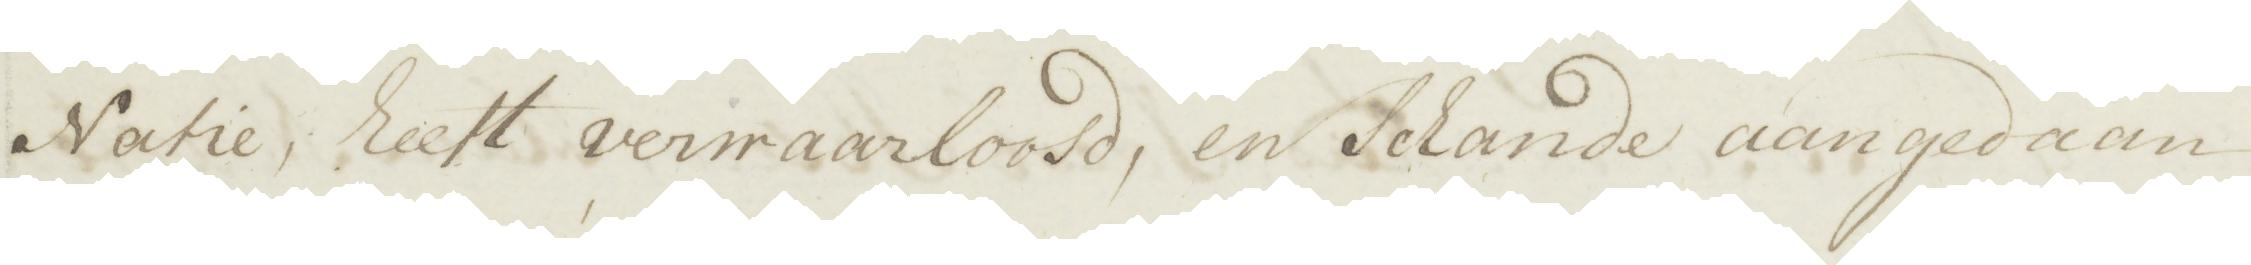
Natie, heeft verwaarloosd, en schande aangedaan
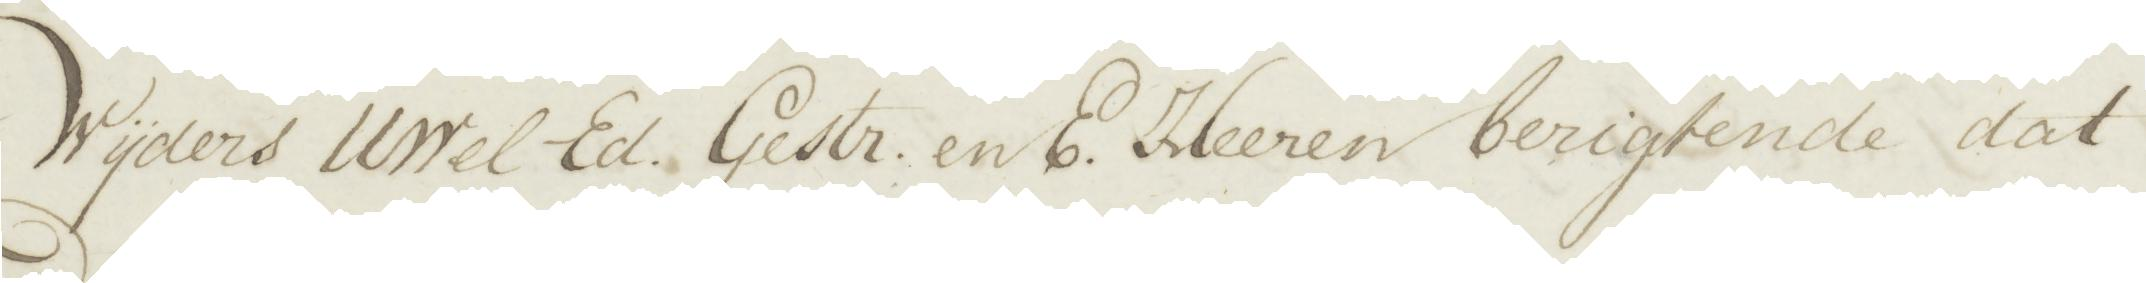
Wijders UWel Ed. Gestr. en E. Heeren berigtende dat
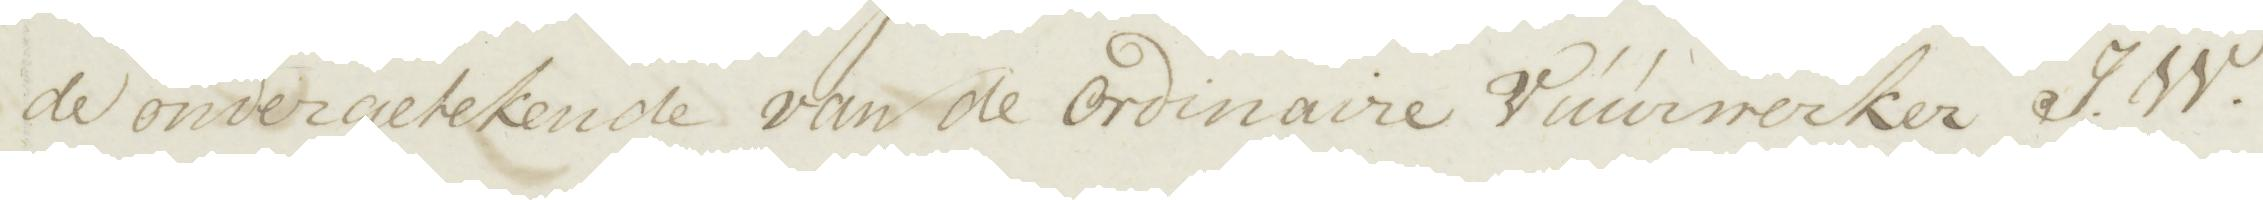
de ondergetekende van de ordinaire vuurwerker J. W.
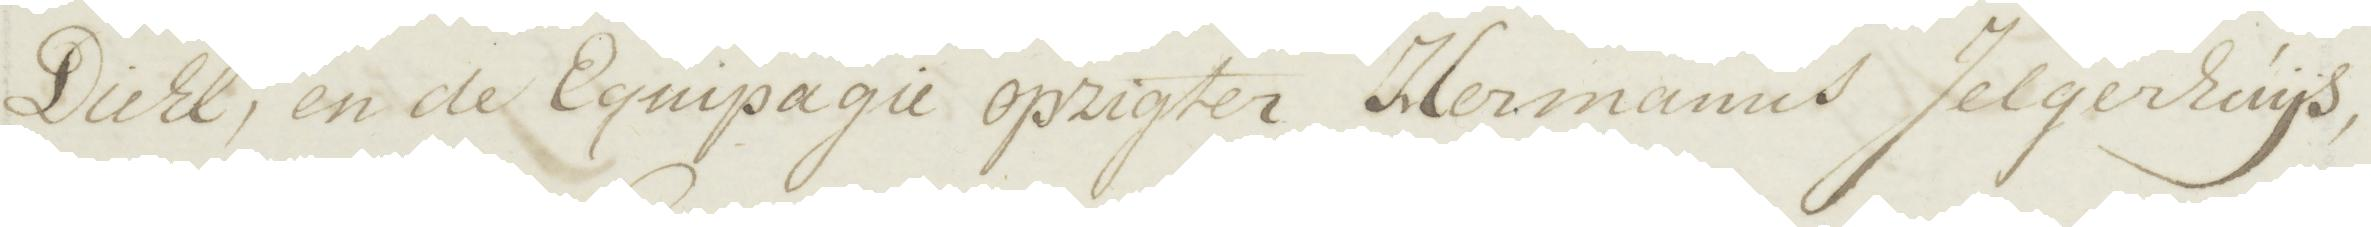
Diehl, en de Equipagie opzigter Hermanus Jelgerhuijs,
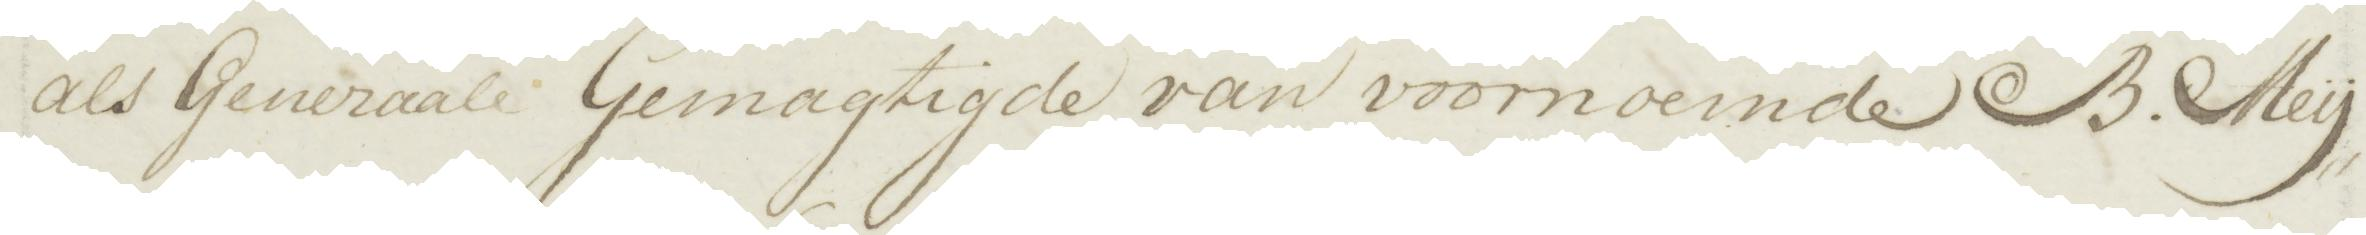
als Generaale Gemagtigde van voornoemde B, Meij„
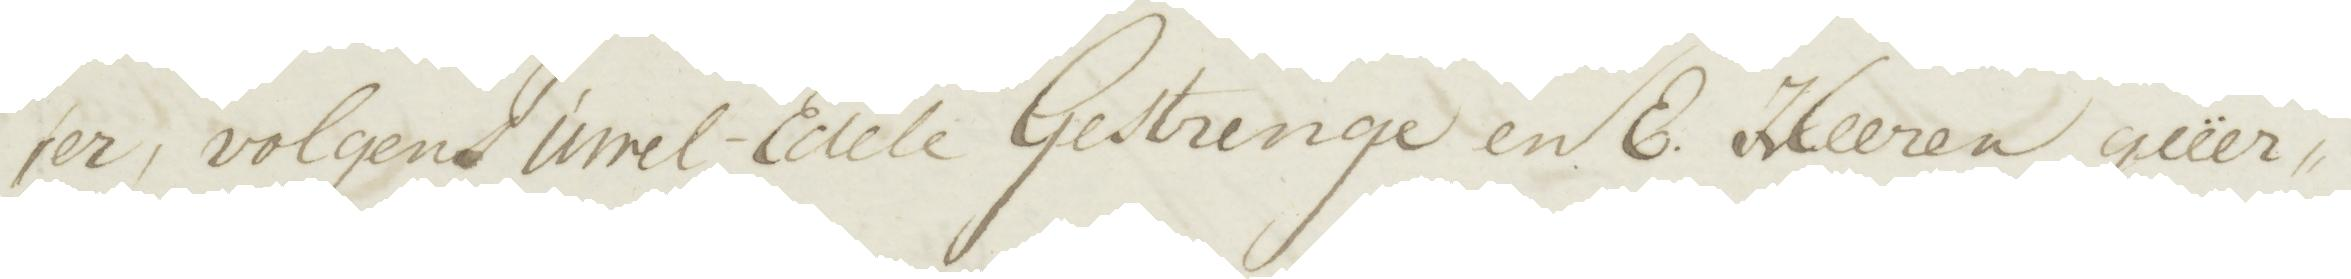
er, volgens uwel Edele Gestrenge en E: Heeren geëer„
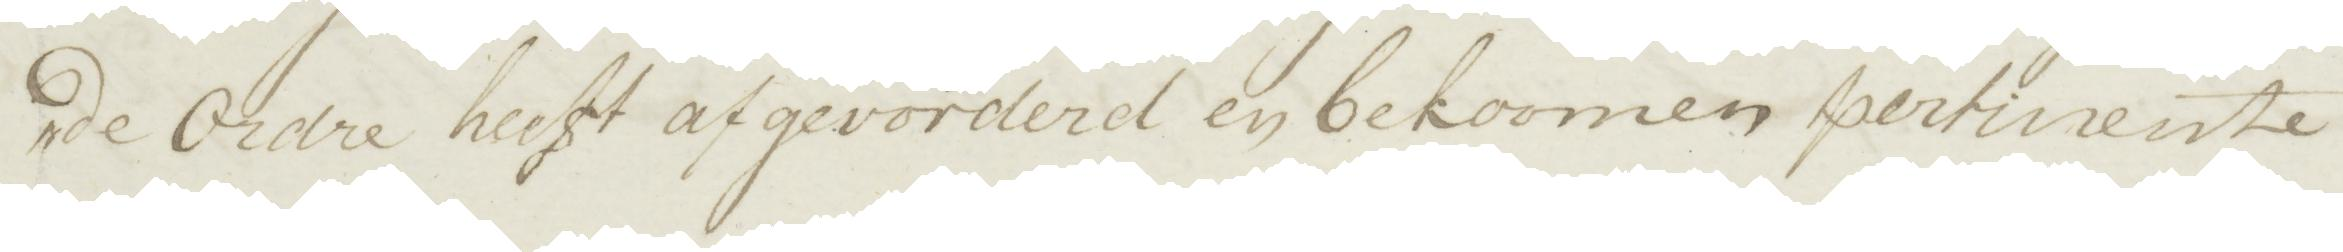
„de Ordre heeft afgevorderd en bekoomen pertinente
